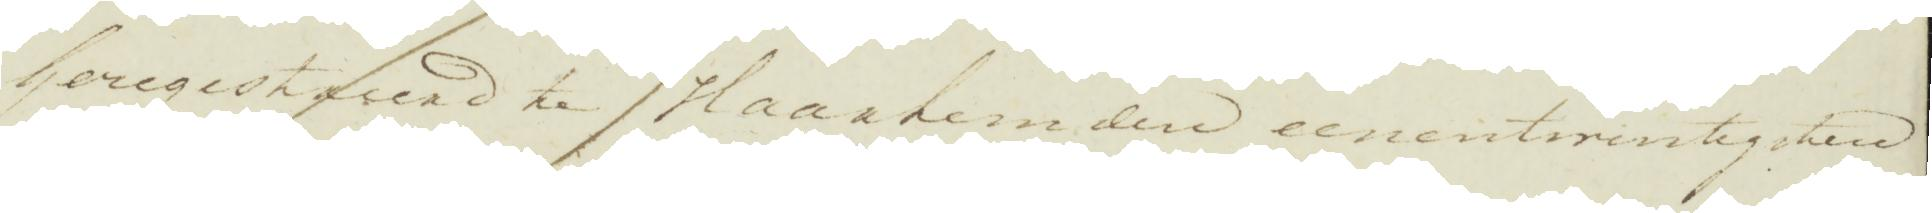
Geregistreerd te Haarlem den eenentwintigtigsten
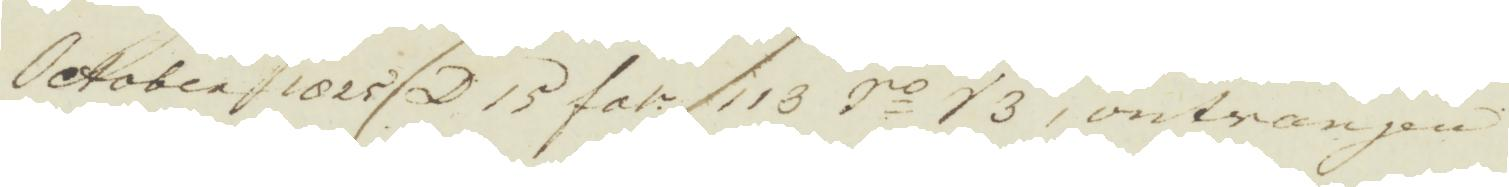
October 1825 D 15 fak. 113 n=o 13, ontvangen
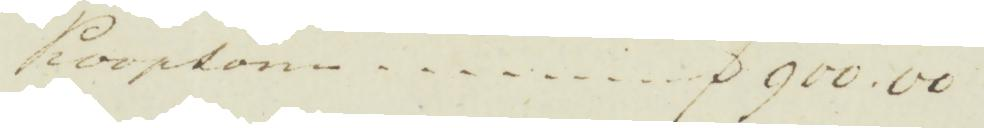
koopsom - - - - - - - - -ƒ 900.00
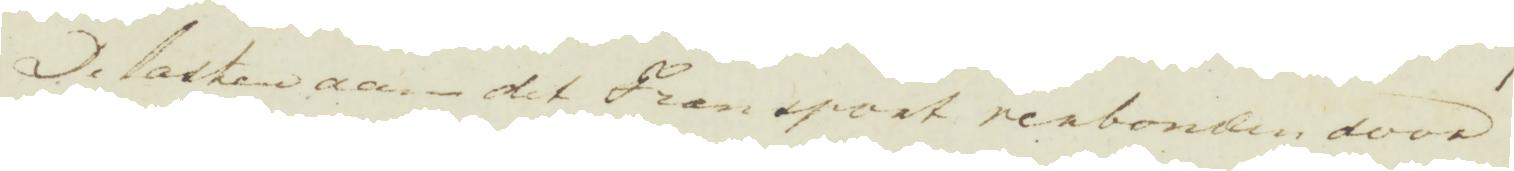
De lasten aan dit Transport verbonden door
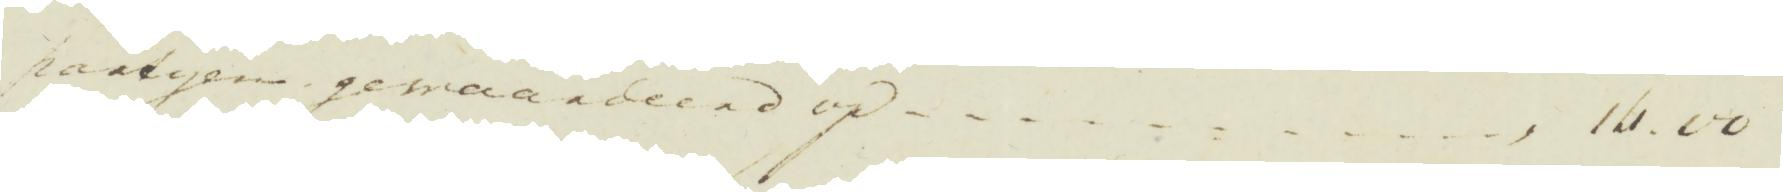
partyen gewaardeerd op. . . . . . . . . . . , 14.00
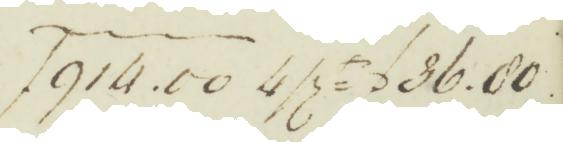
ƒ 914.00 4 p=t ƒ 36.80
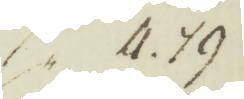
„ 4.79
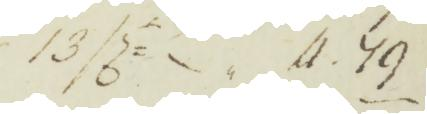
13 pr=t „ 4. 79
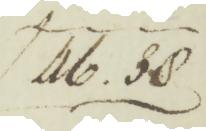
ƒ 46.38
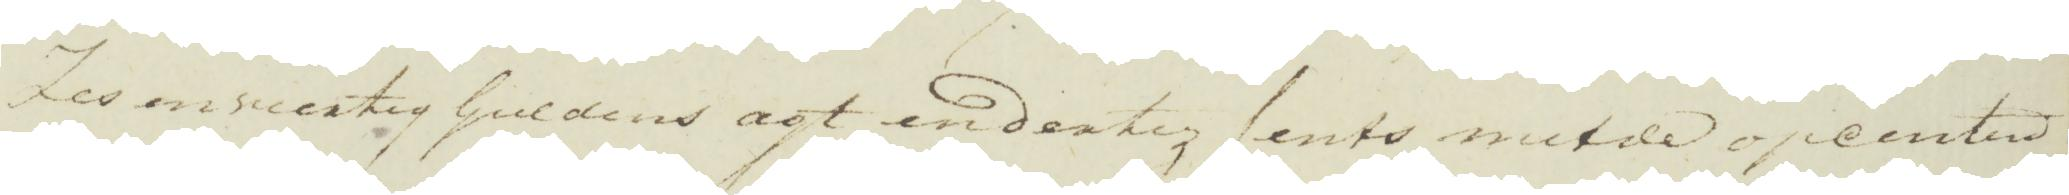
Zes enveertig guldens agt endertig Cents metde opcentens
